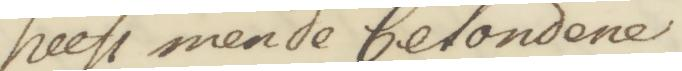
heeft men de besondene
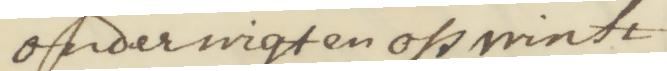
onderwigten op winst
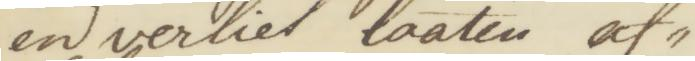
en verlies laaten af„
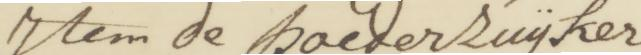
Jtem de poederzuijker
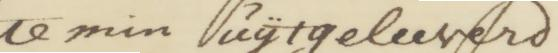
te min uijtgeleeverd
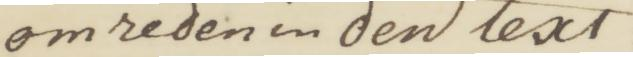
om reden in den text
